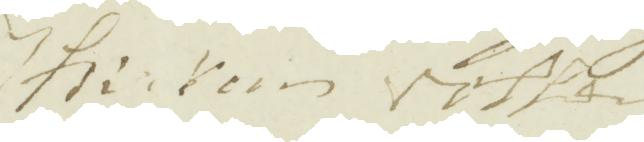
Thirkens Vossen
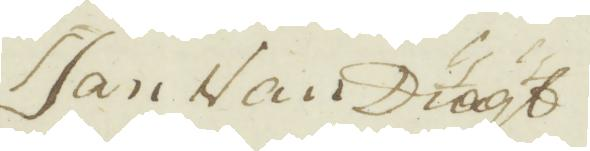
Jan Van Dragt
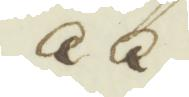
Q Q
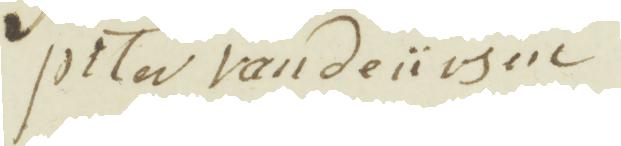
Piter van Deursen
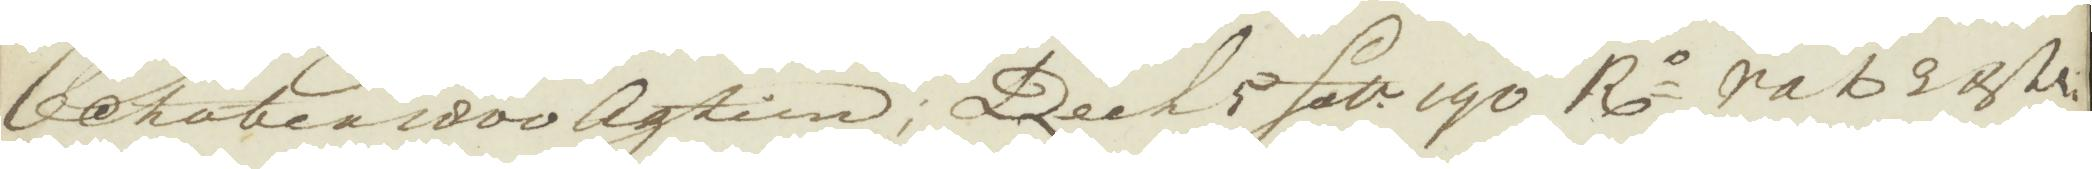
October 1800 Agtien; Deel 5 fol.i 190 R=o vak 3 & 4.
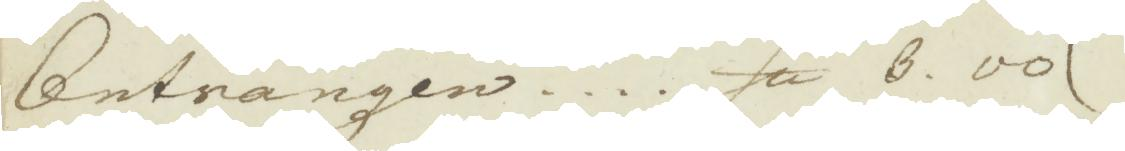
Ontvangen . . . . ƒ 3. 00
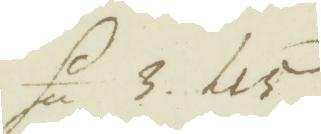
ƒ 3. 45
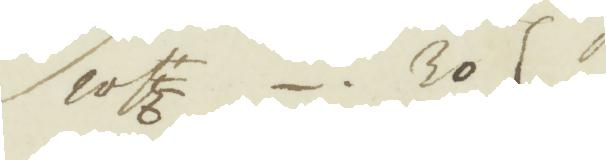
10 /c=t – . 30
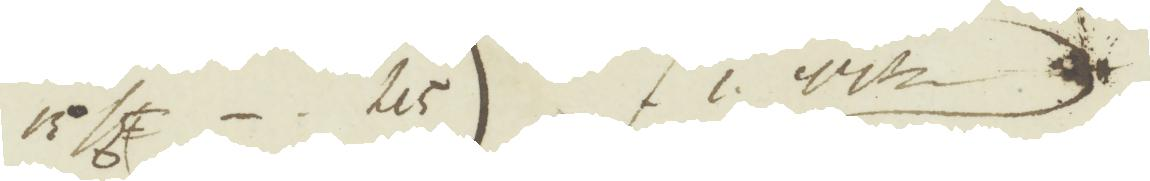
10 /c=t – . 45 ƒ 1. 44½.
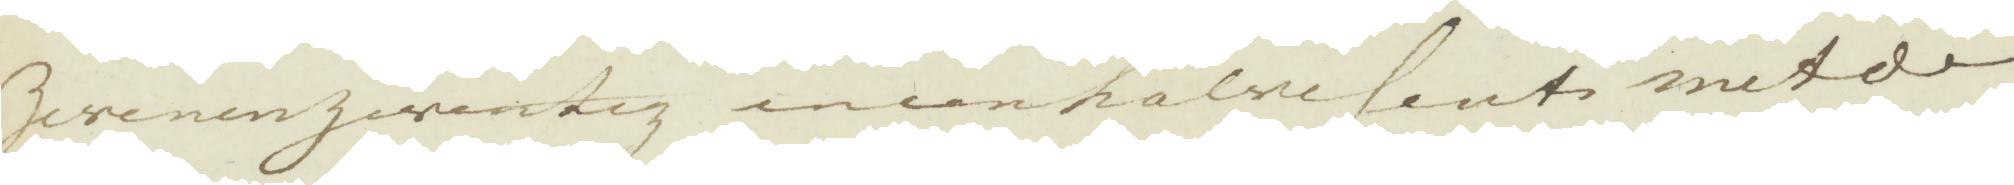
Zevenenzeventig en een halve Cents met de
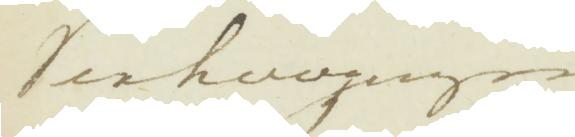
Verhooging
